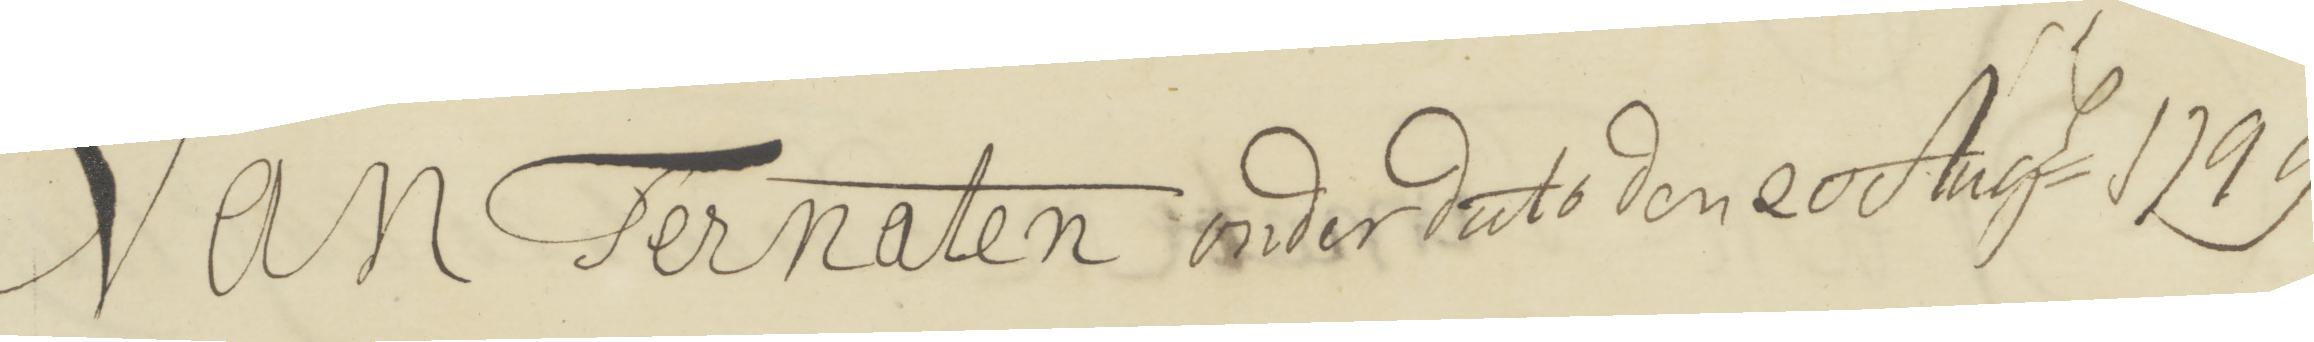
Van Ternaten onder dato den 20 Aug=o 1749
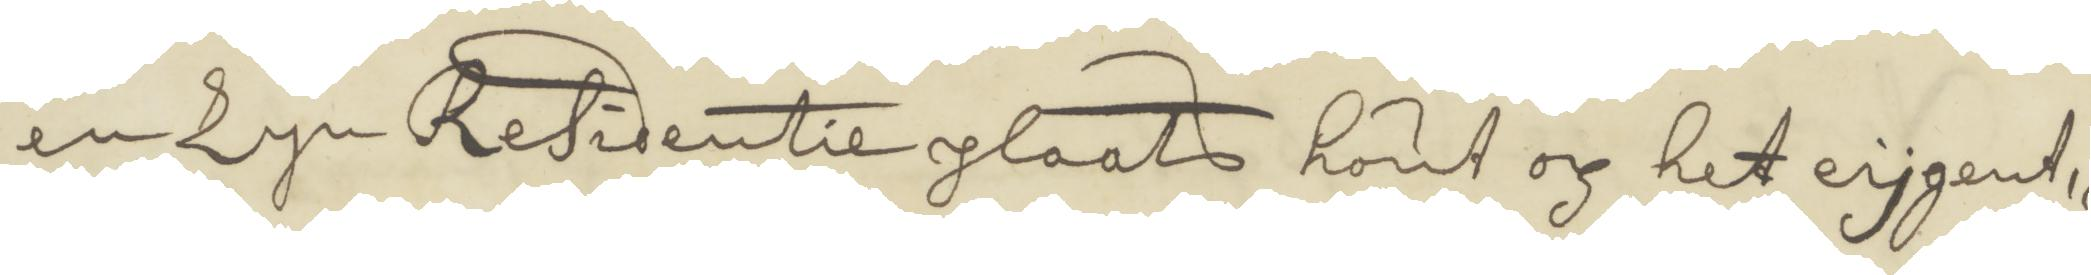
en zyn Residentie plaats hout op het eijgent
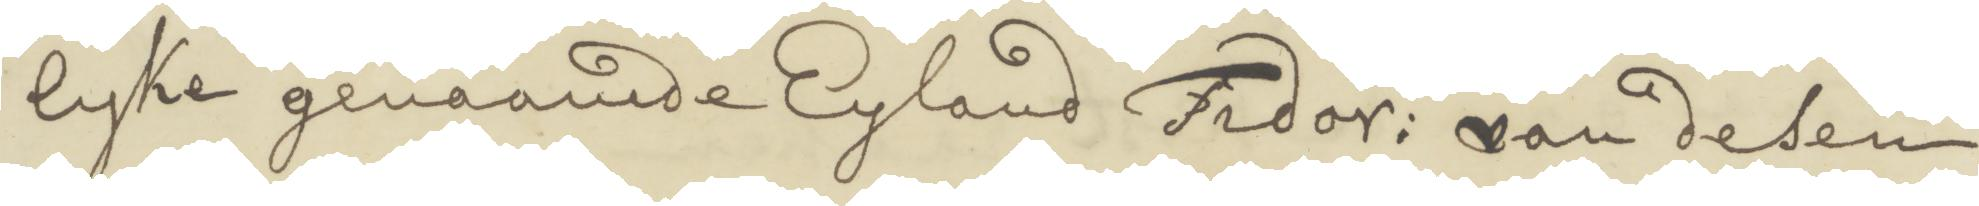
lyke genaamde Eyland Tidor: van desen
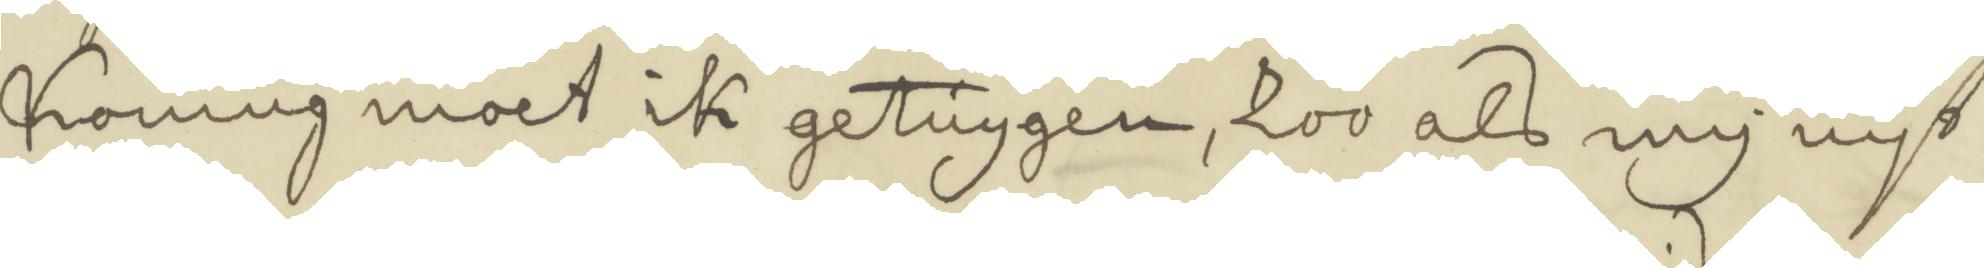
Koning moet ik getuygen, zoo als mij uyt
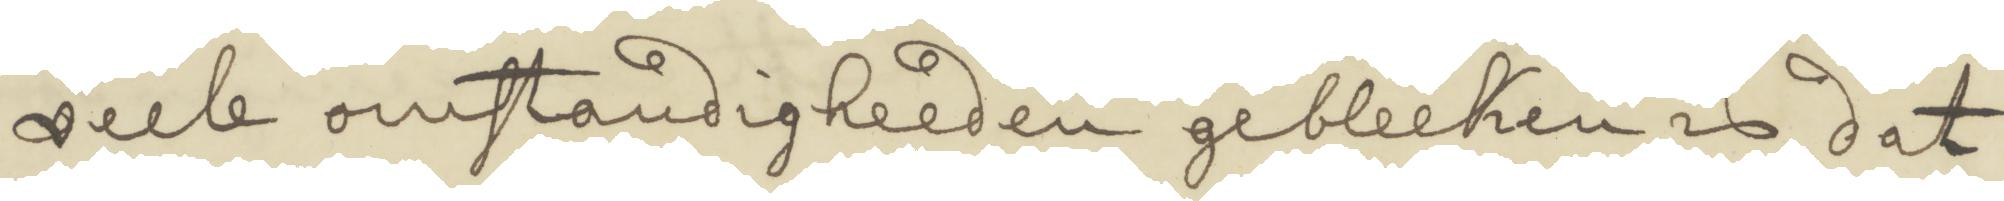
veele omstandigheeden gebleeken is, dat
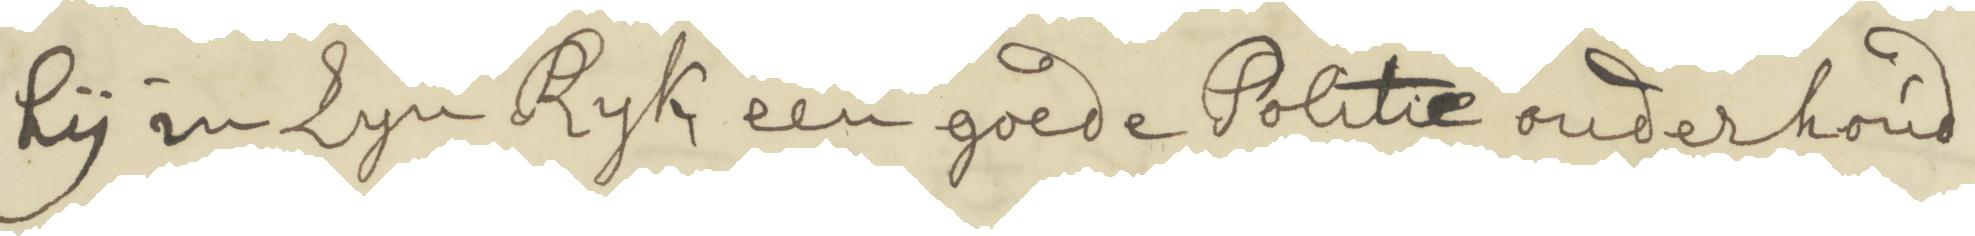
hij in zyn Ryk een goede Politie onderhoud
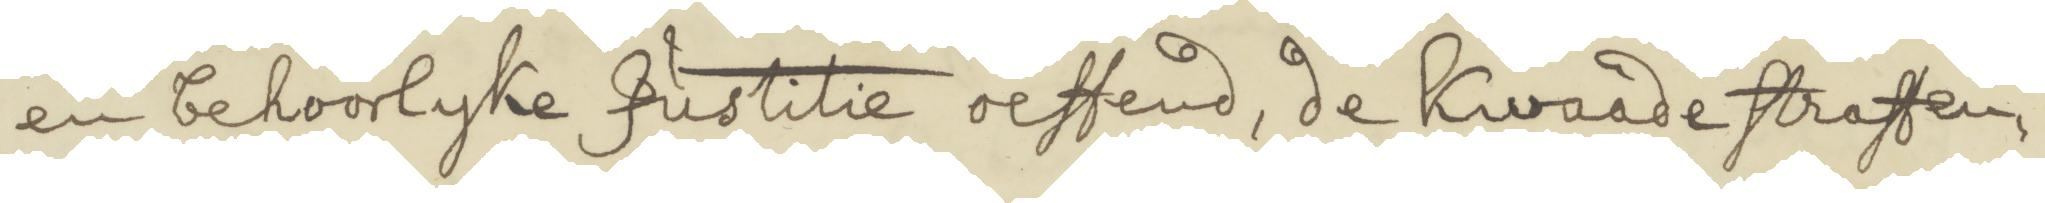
en behoorlyke Justitie oeffend, de kwaade straffen„
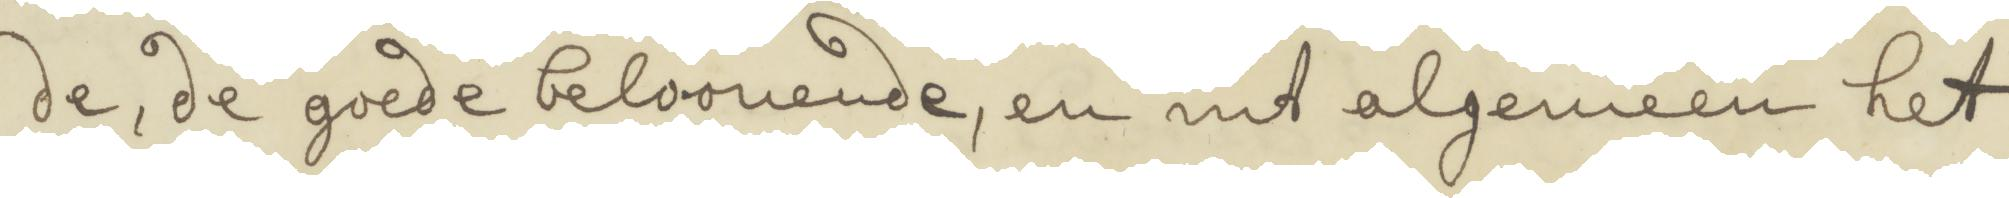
de, de goede beloonende, en int algemeen het
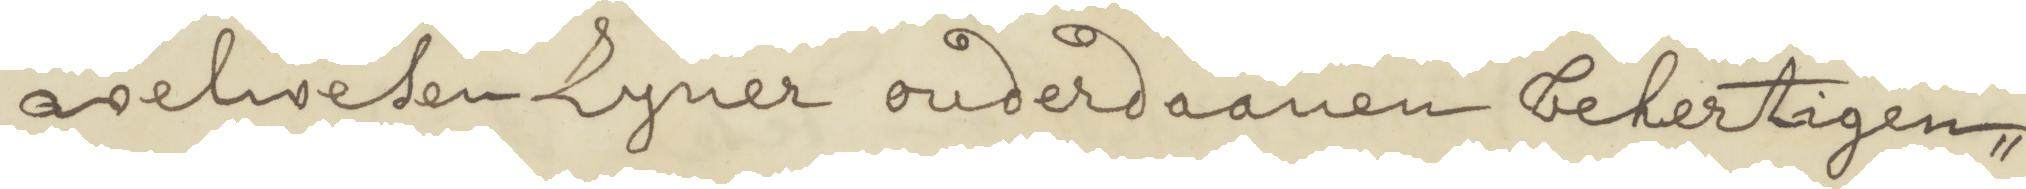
welwesen zyner onderdaanen behertigen„
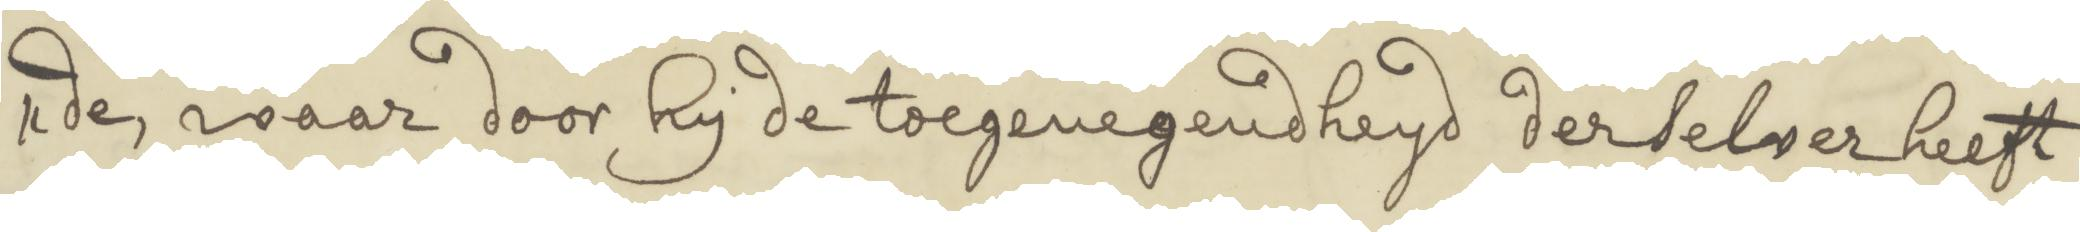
de, waar door hij de toegenegendheyd derselver heeft
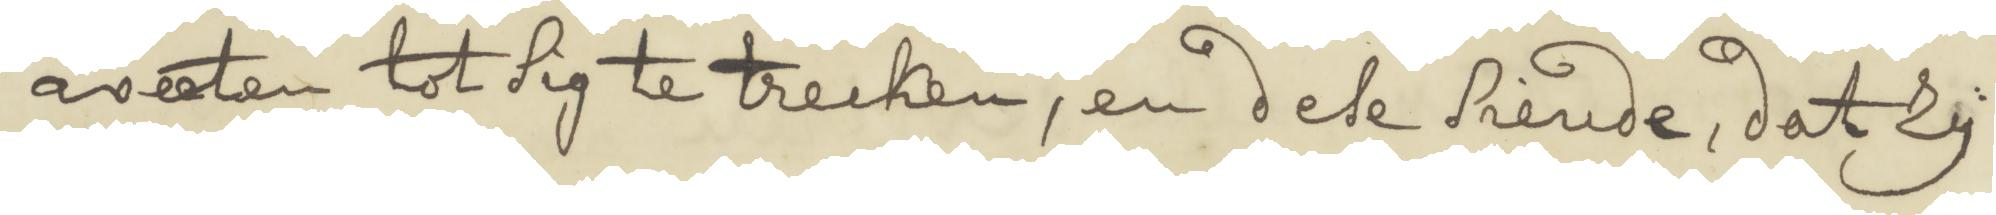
weeten tot sig te trecken, en dese siende, dat zij
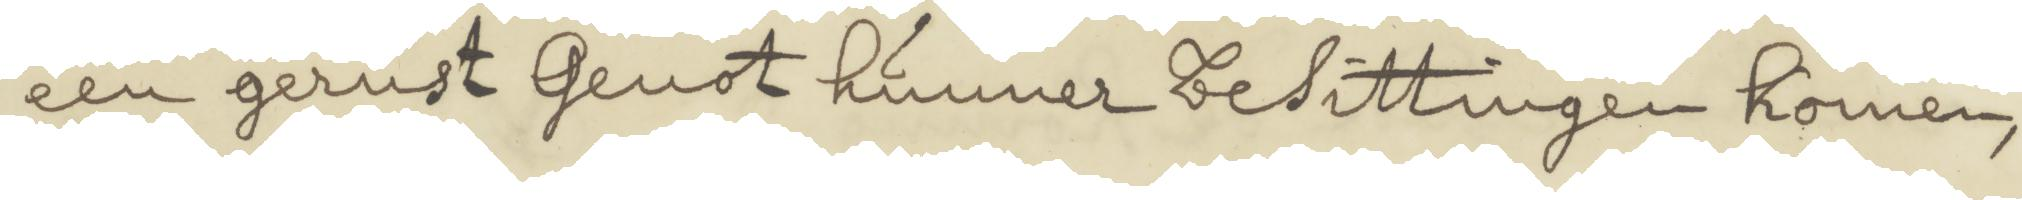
een gerust genot hunner besittingen komen,
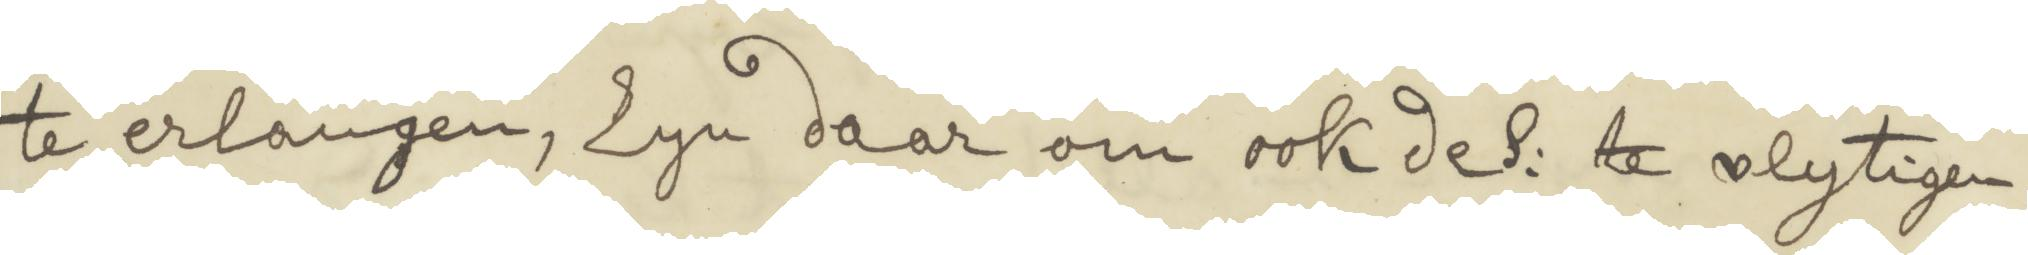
te erlangen, zyn daar om ook des: te vlytigen
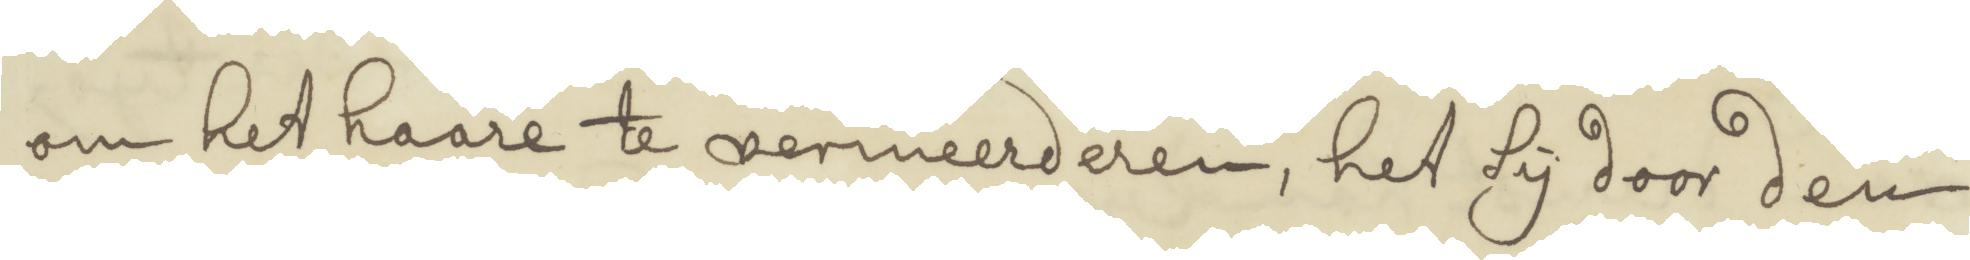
om het haare te vermeerderen, het sij door den
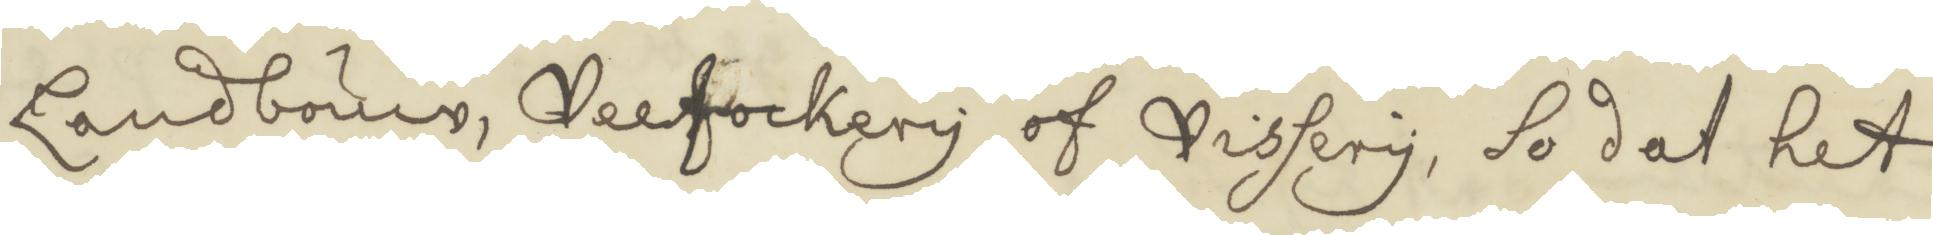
landbouw, Veefockerij of visserij, so dat het
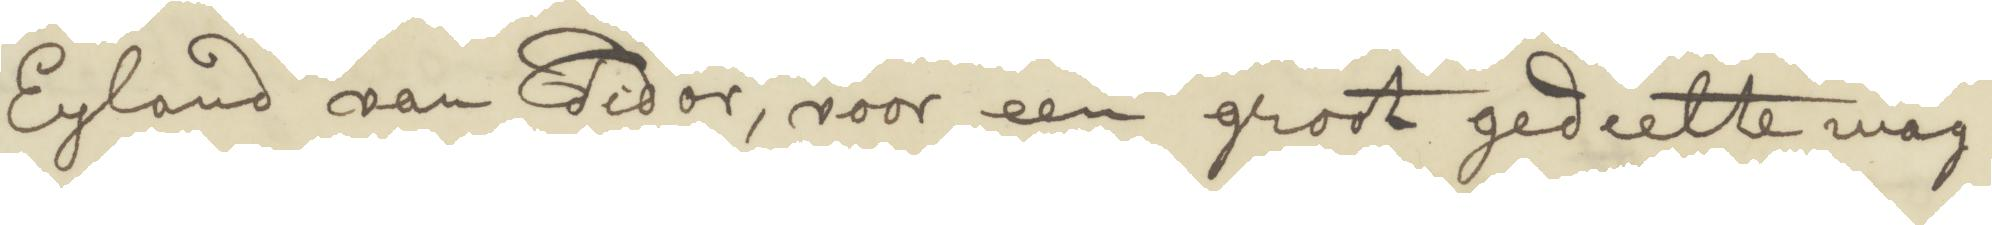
Eyland van Tidor, voor een groot gedeelte mag
